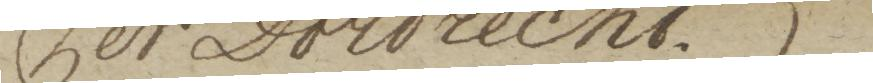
Per Dordrecht.
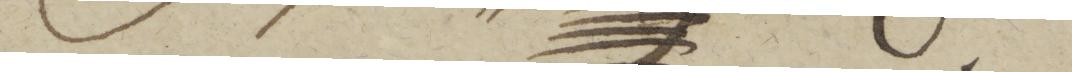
N„o 6.
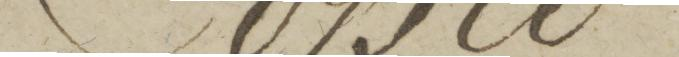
Copië
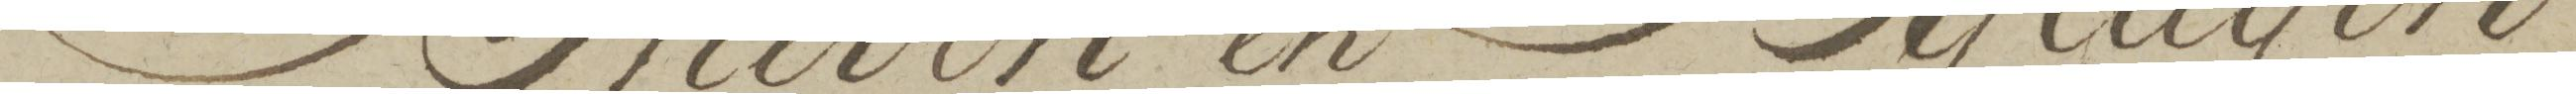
Brieven en Bijlagen
